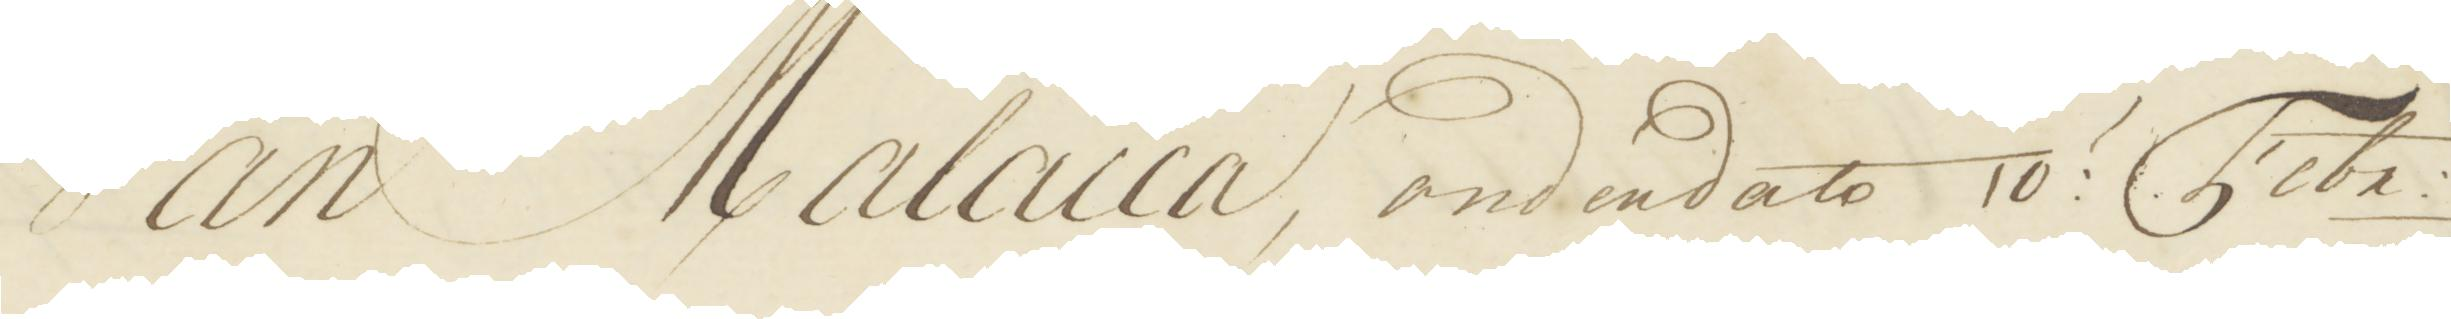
Van Malacca, onderdato 10:' Febr: 1741
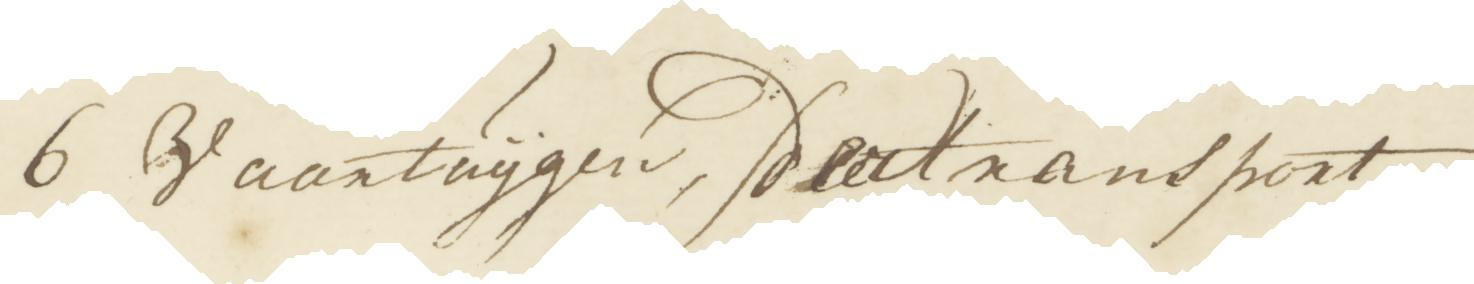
6 Vaartuijgen, per transport.
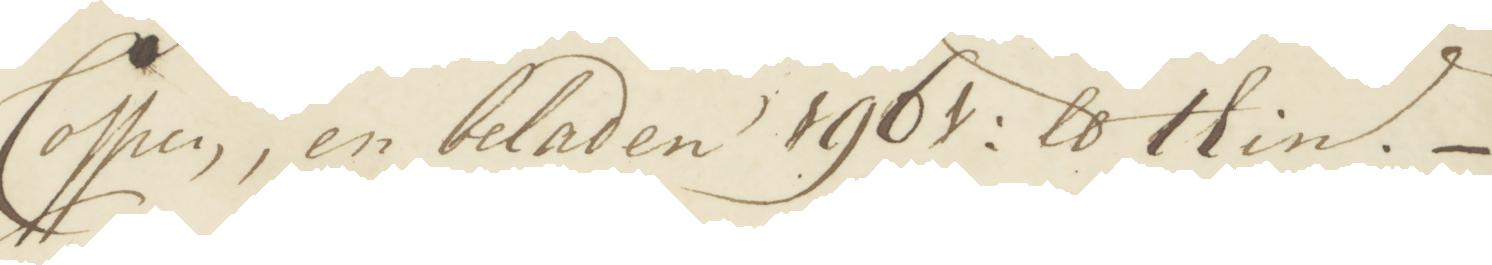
Coppen, en beladen 1961: lb thin.
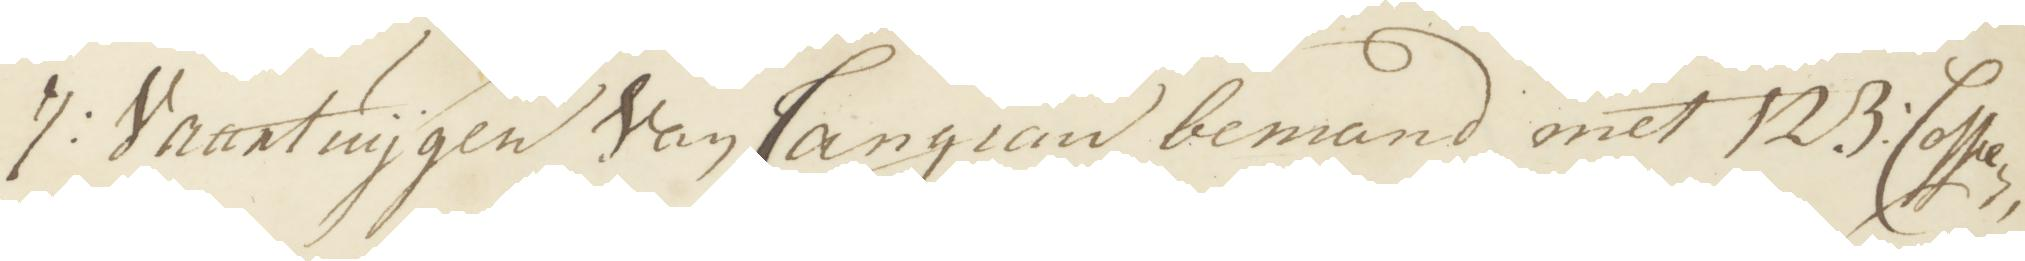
7: Vaartuijgen van Cangian bemand met 123: Coppen,
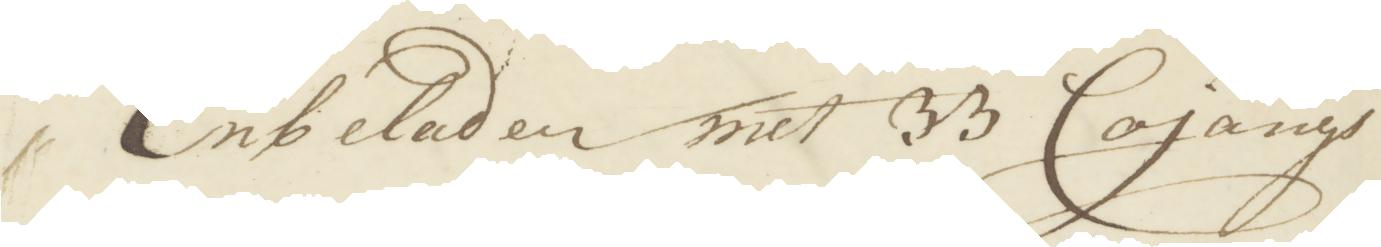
En beladen met 33 Cojangs
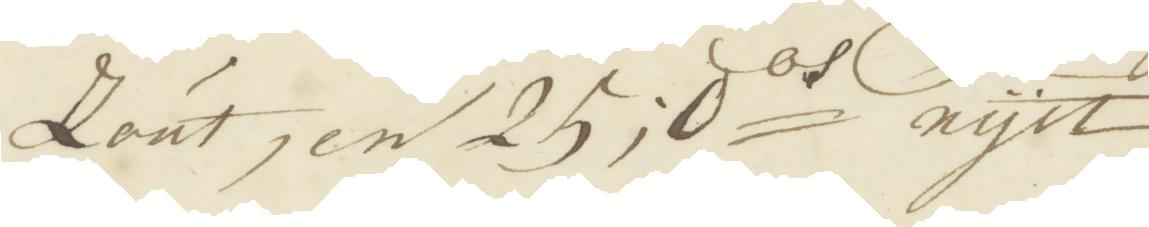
zout, en 25; d=os rijst.
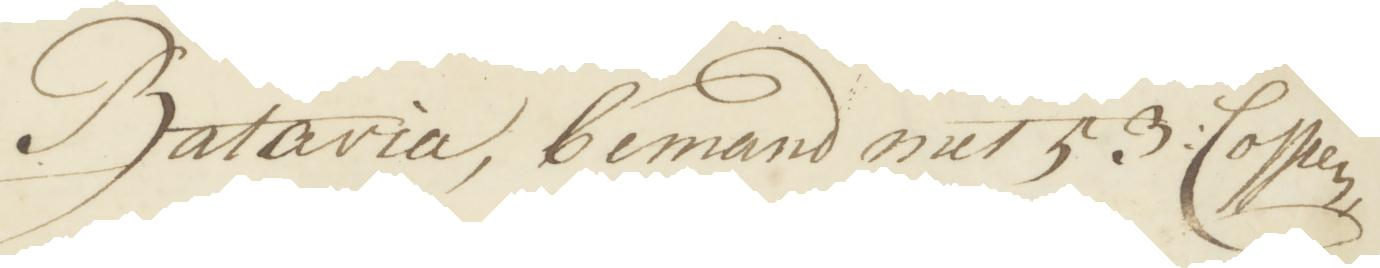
2: _=o Batavia, bemand met 53: Coppen,
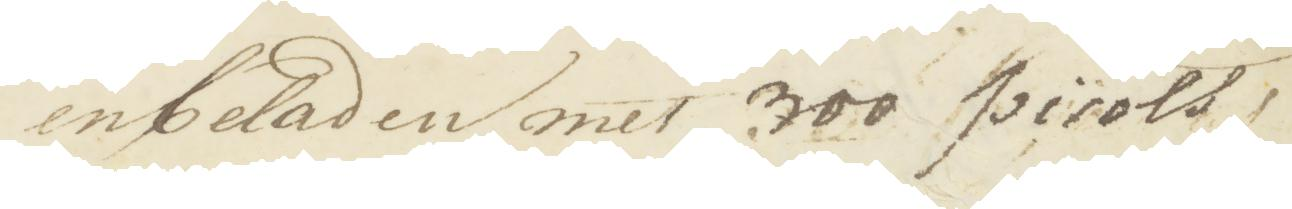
en beladen met 300 picols
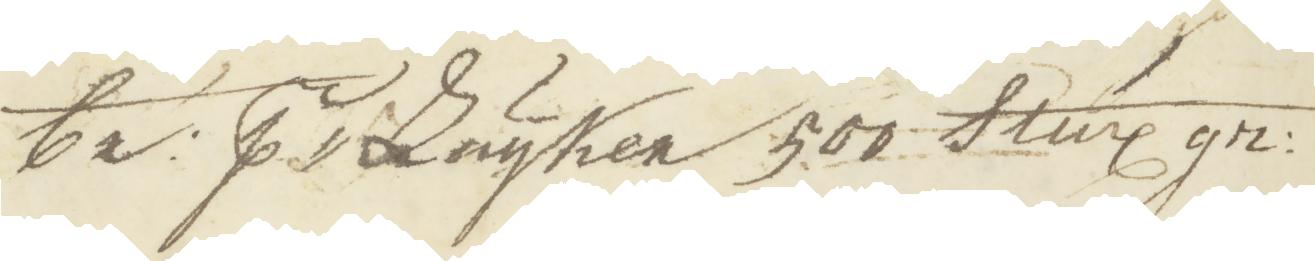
br: p„r zuijker 500 Stux gr:
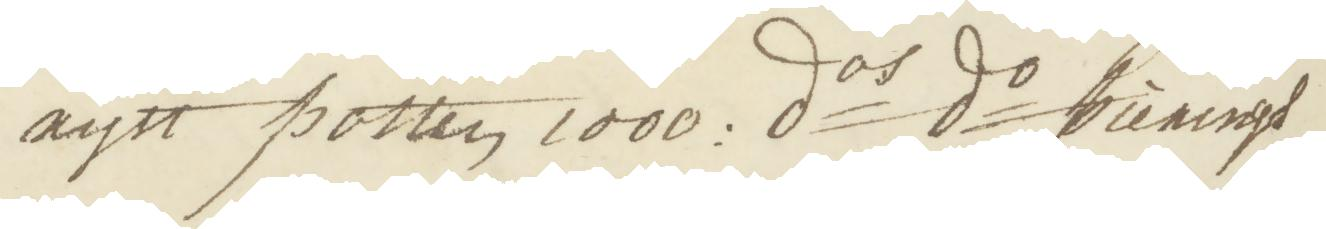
rijst potten 1000: d=os d=o purings
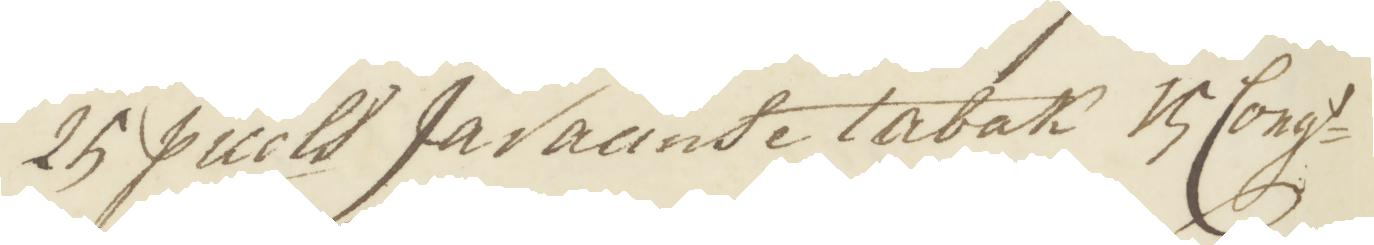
25 picols Javaanse tabak 15 Cong=s
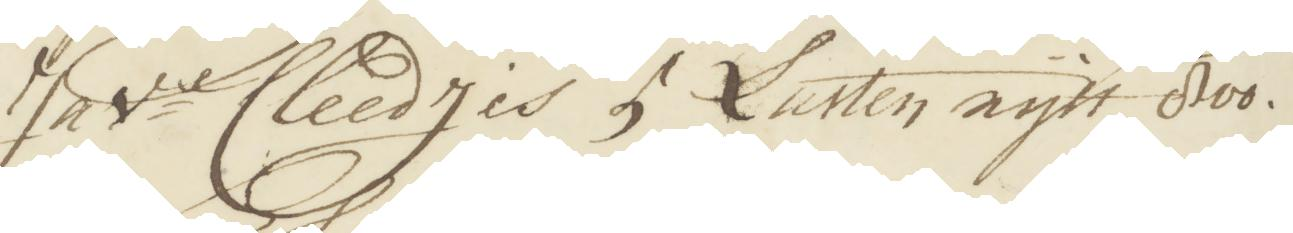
Jav=se Cleedjes 5 lasten rijst 800.
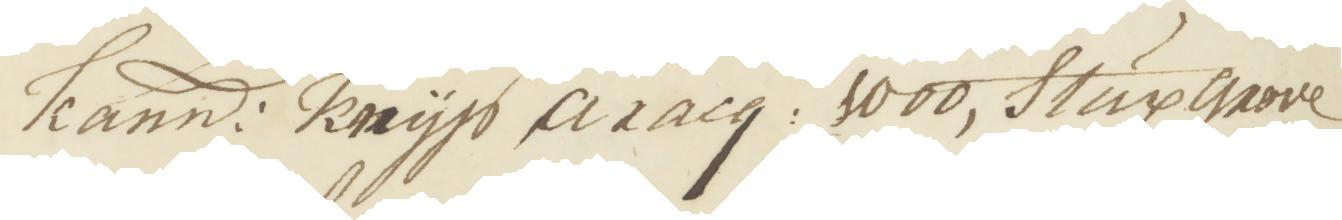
kann: krijp aracq: 1000, stux grove
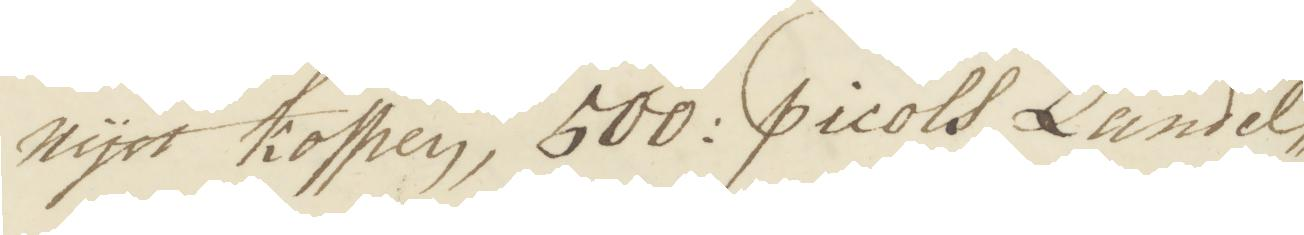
rijst koppen, 500: picols zandel„
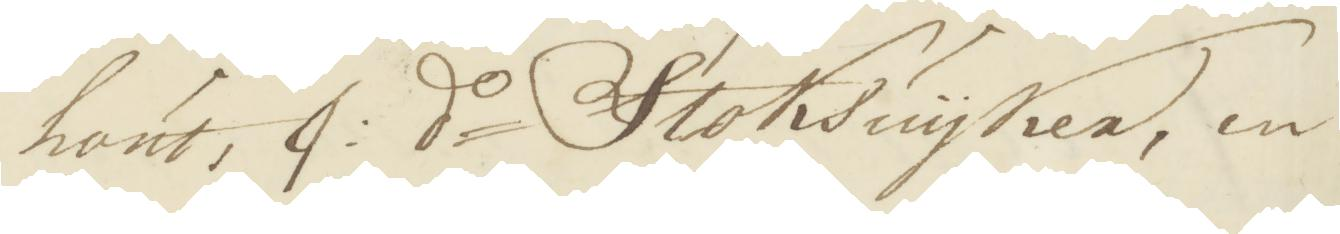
hout, 4: d=o Stoksuijker, en
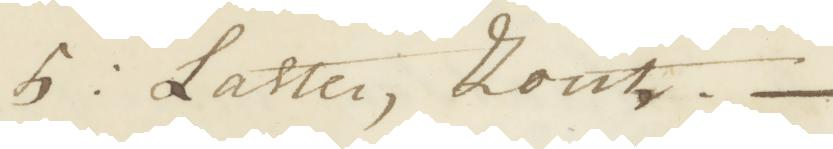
5: Lasten zout.
